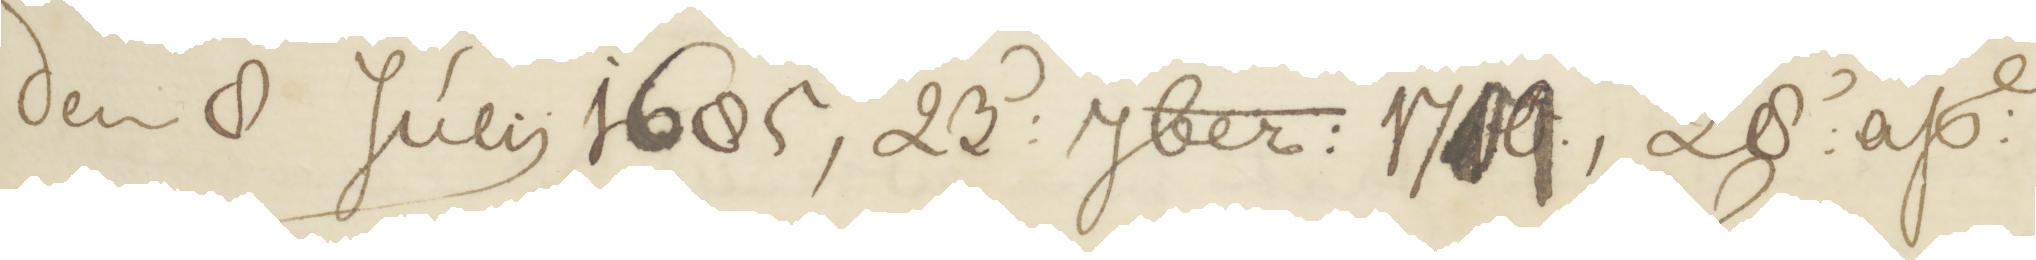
den 8 Julij 1685, 23': Jber: 1704, 28': ap:l
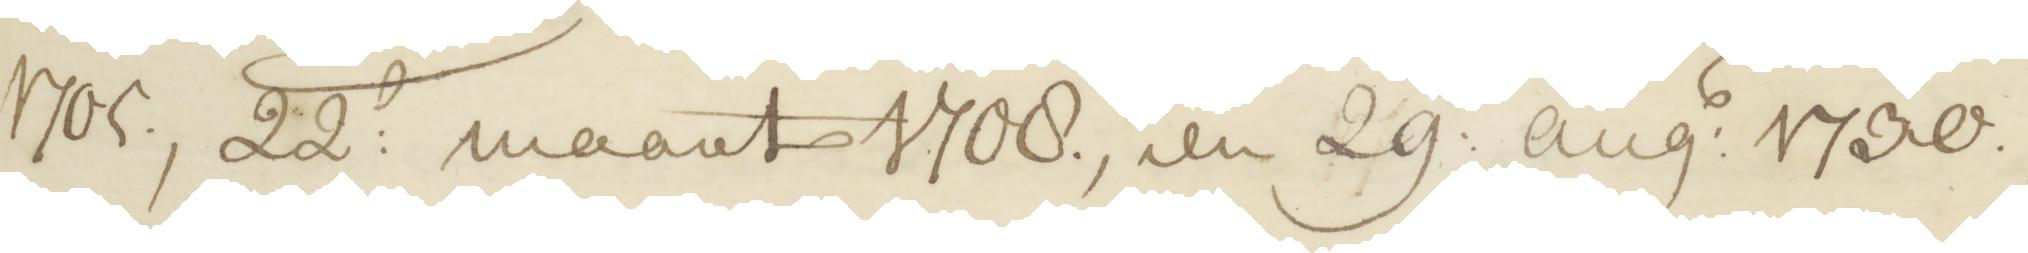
1705., 22:' maart 1708., en 29: aug:s 1730.,
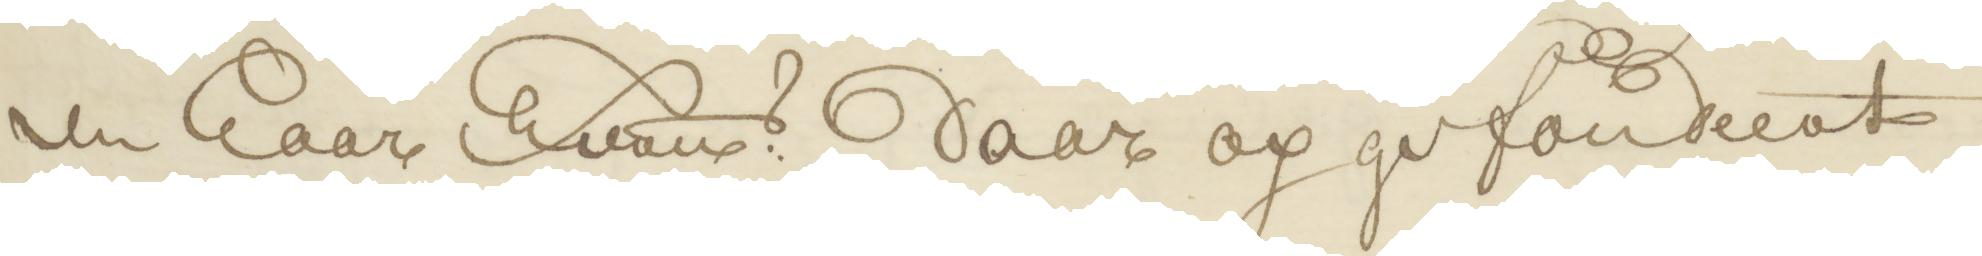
en haar Eerw:s daar op gefondeert
